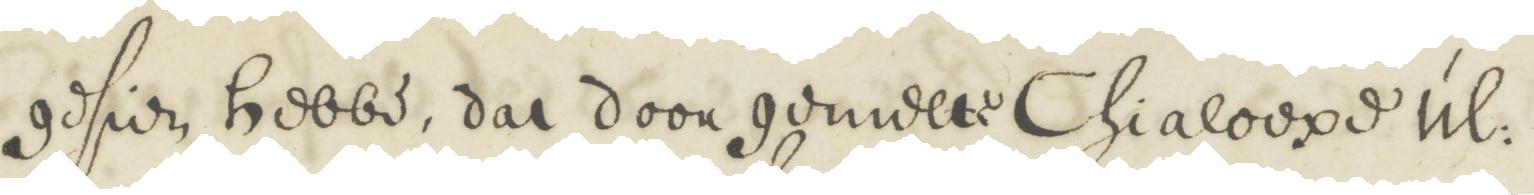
gesien hebbe, dat door gemelte Chialoepe ul:
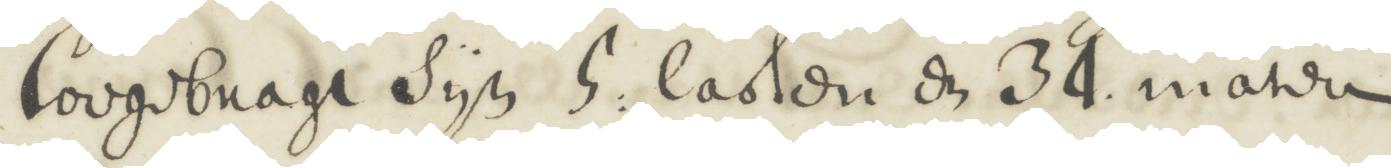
toegebragt sijn 5: lasten en 34. maten
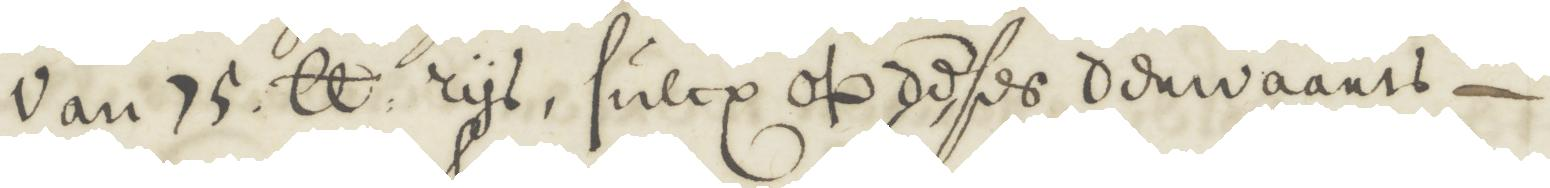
van 75. lb: rijs, sulcx op deses derwaarts —
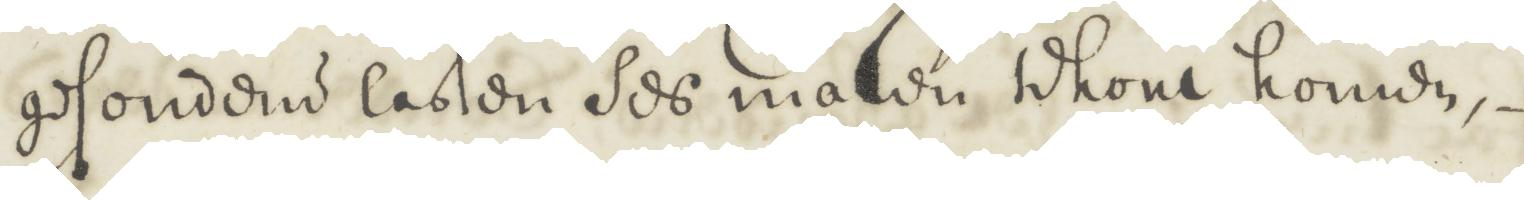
gesondene lasten ses maten tekort komen, -
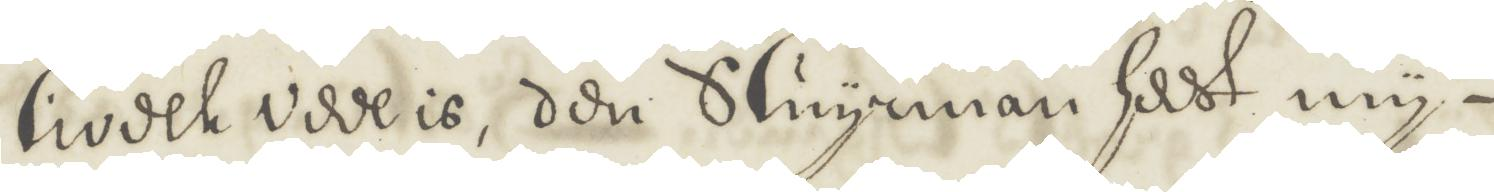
twelk veel is, den stuijrman heeft mij —
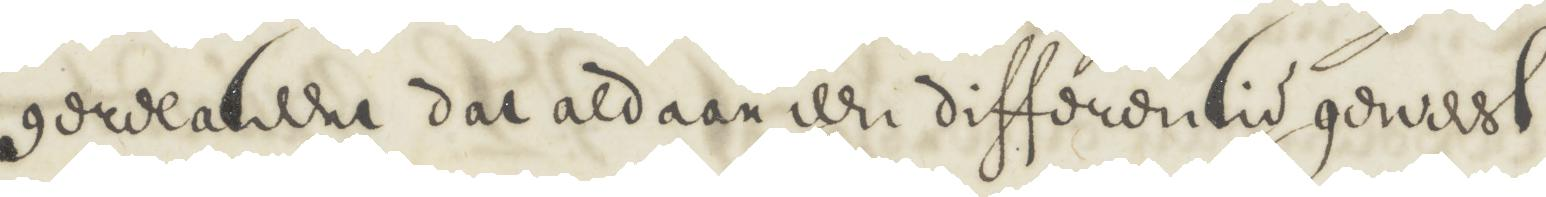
gerelateert dat aldaar een differentie geweest
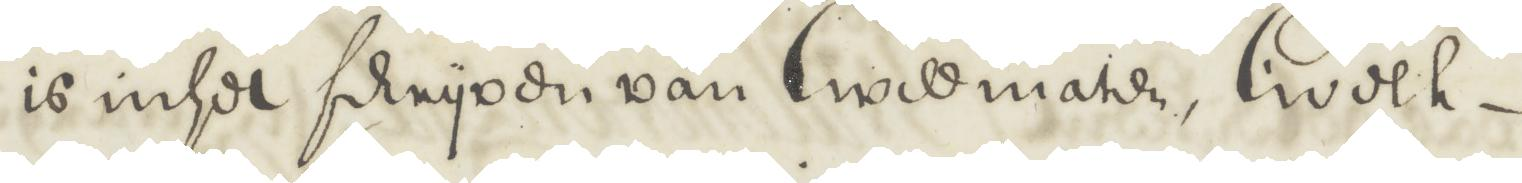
is inhet schrijven van twee maten, twelk —
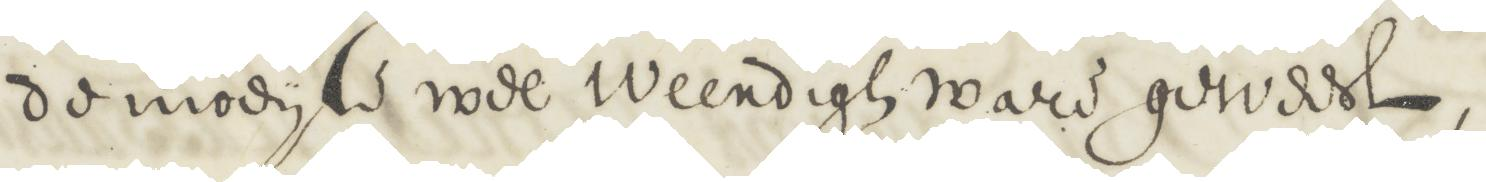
de moeijte wel weerdigh ware geweest,
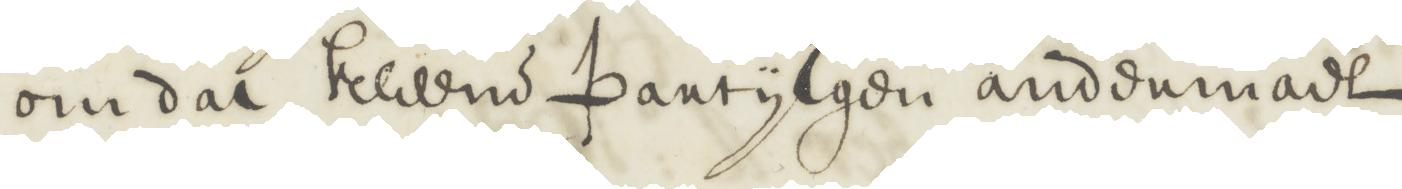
om dat kleene partijtgen andermael
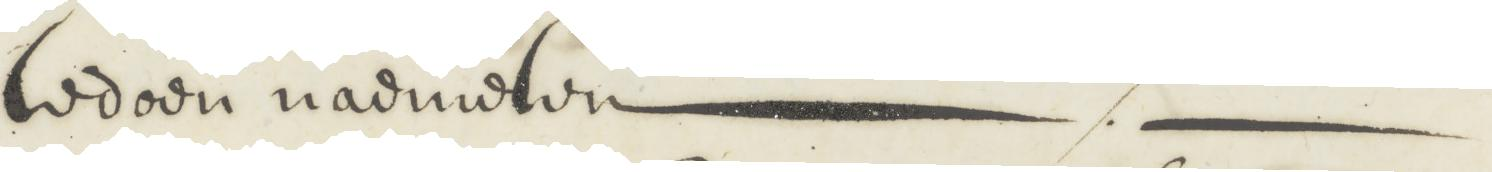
tedoen naemeten. —
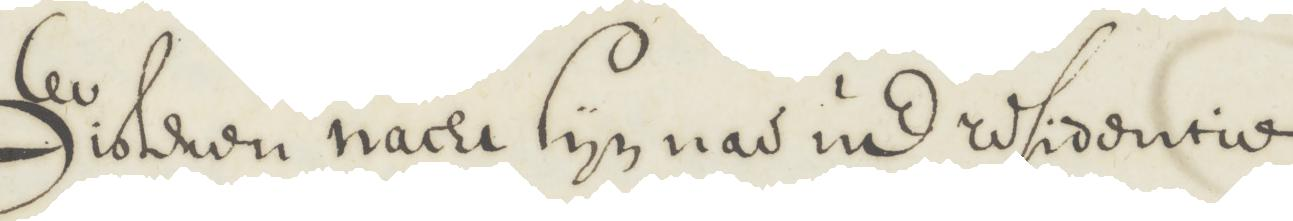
Gisteren nacht sijn nae uE residentie
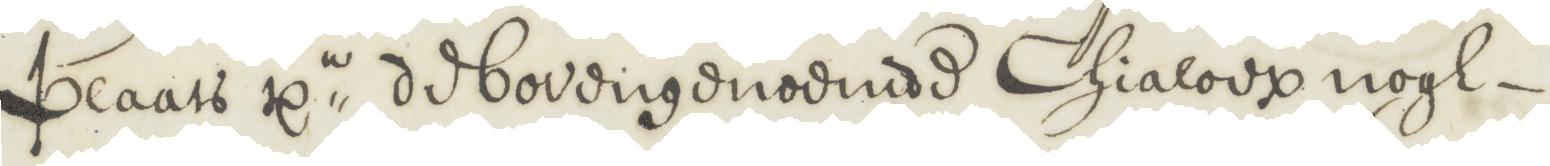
plaats p„r debovengenoemde Chialoep nogh —
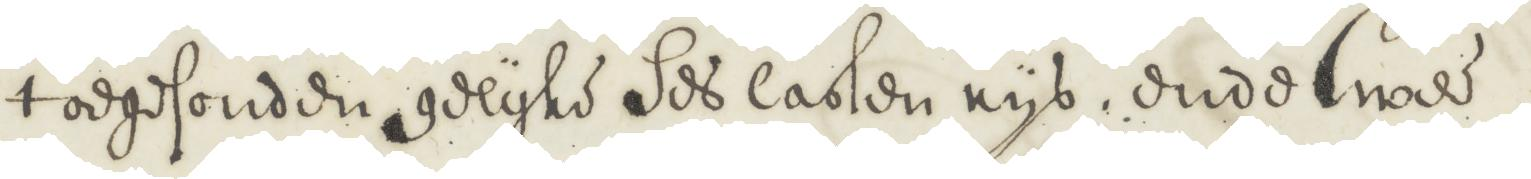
toegesonden gelijke ses lasten rijs, ende twee
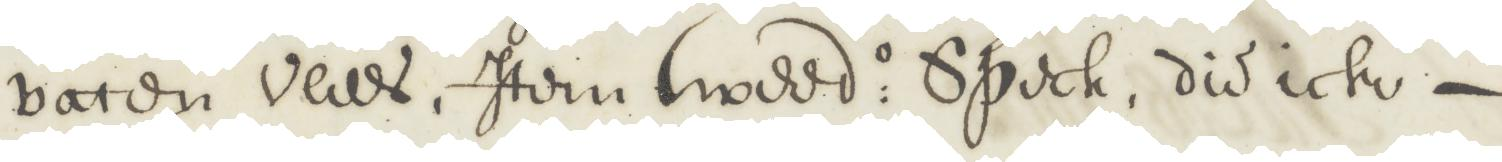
vaten vlees, Item tweed:o speck, die ick —
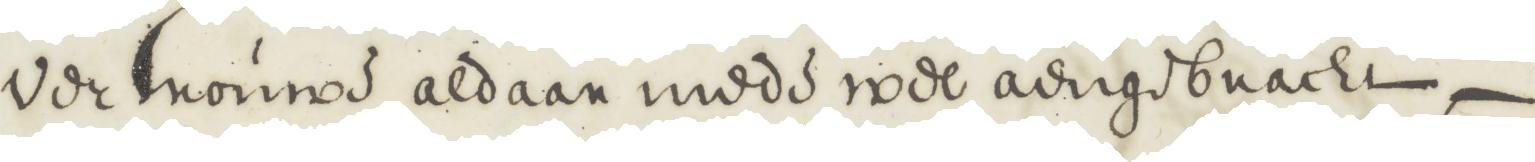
vertrouwe aldaar mede wel aengebracht, —
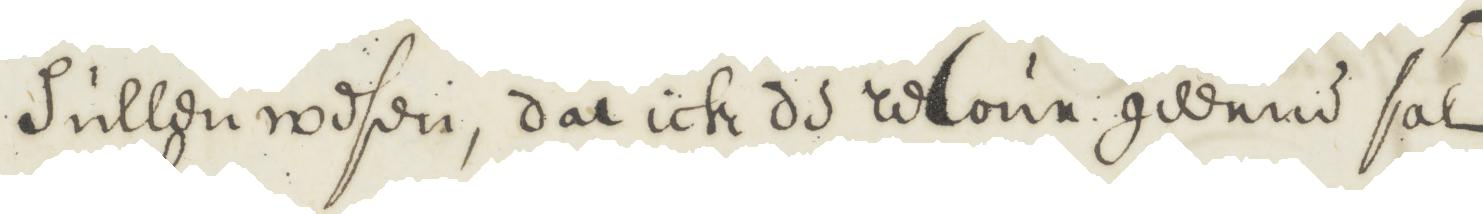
sullen wesen, dat ick de retour: geerne sal
